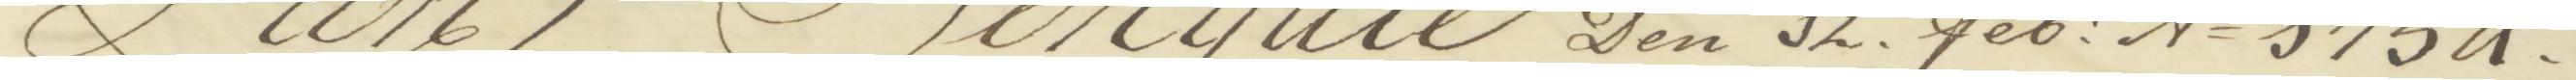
Van Bengale Den 12. feb: A=o 1754.—
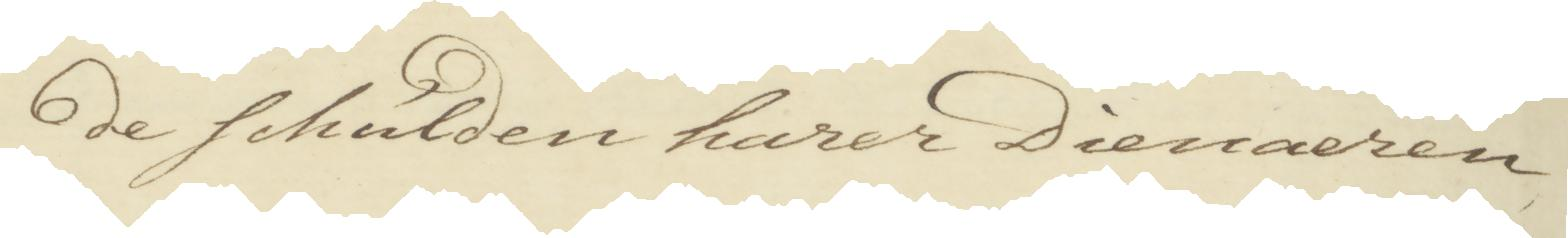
de schulden harer Dienaeren
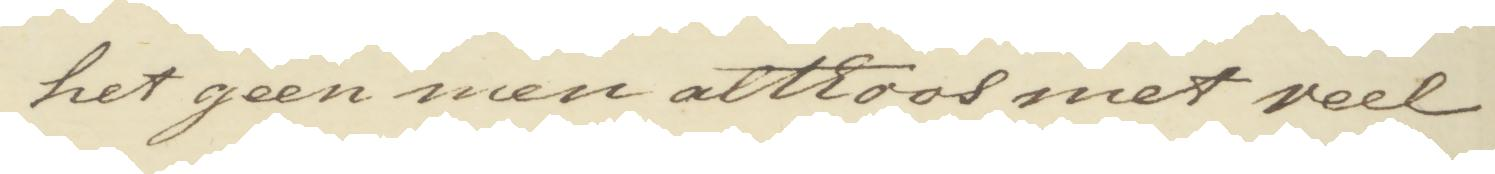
het geen men althoos met veel
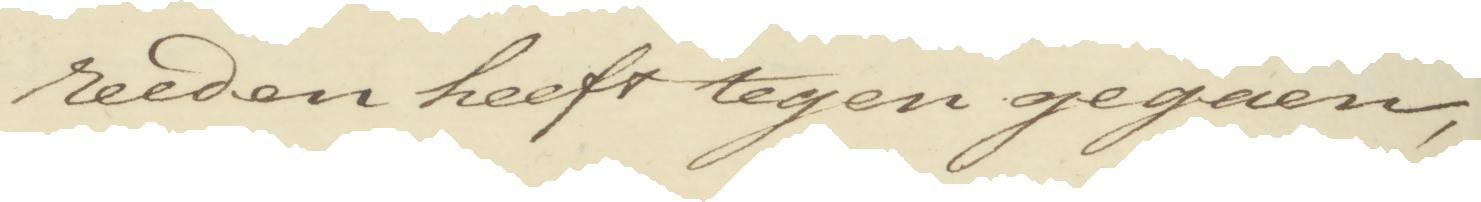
reeden heeft tegen gegaen,
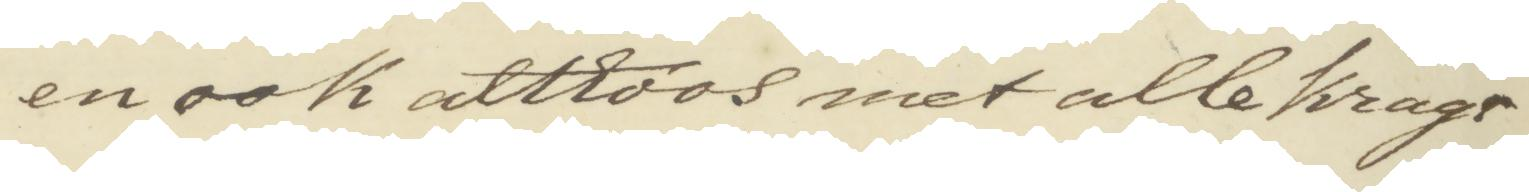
en ook althoos met alle kragt
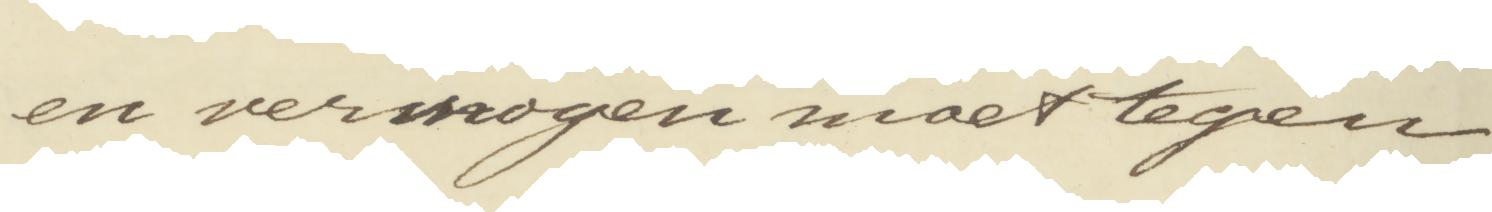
en vermogen moet tegen
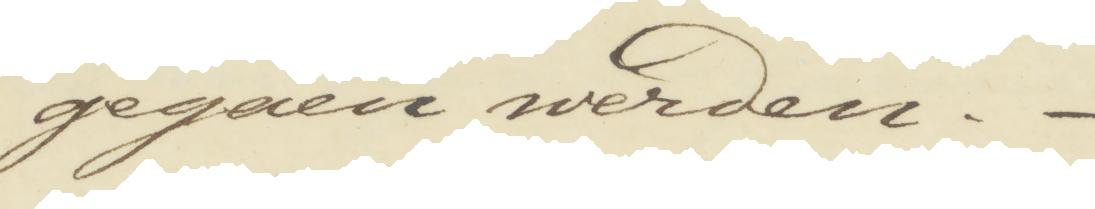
gegaen werden.—
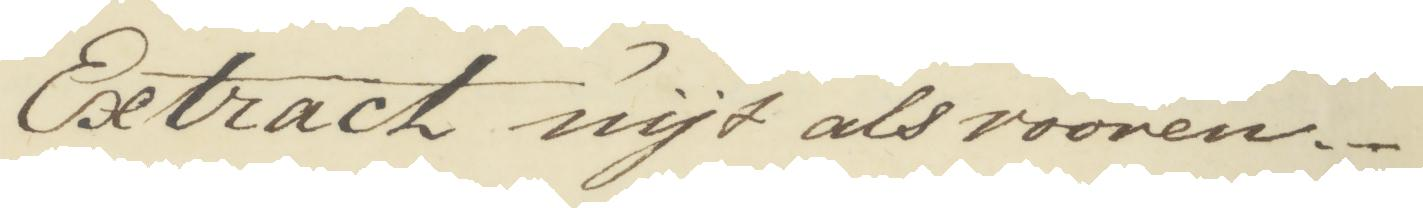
Extract uijt als vooren.—
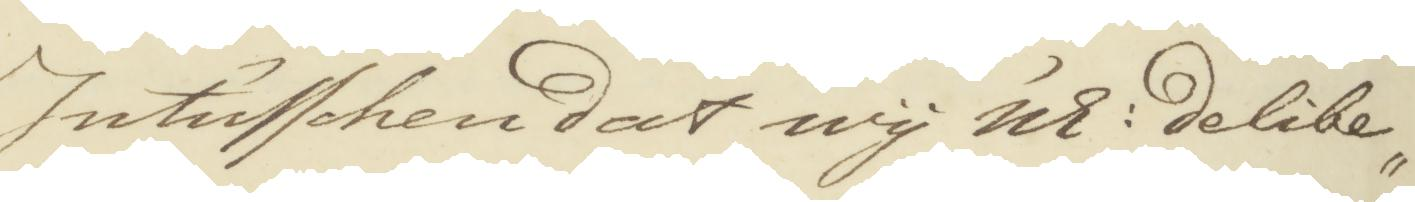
Jntusschen dat wij UE: delibe„
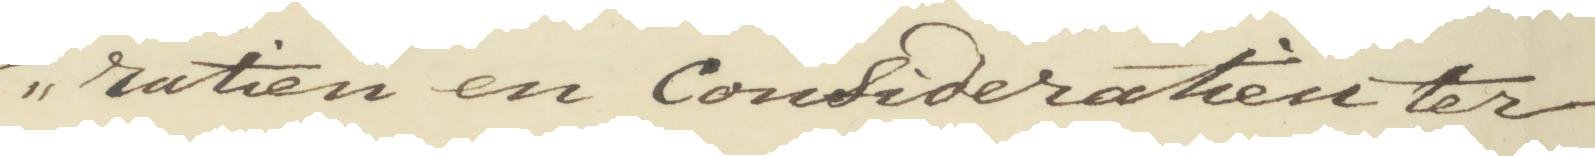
„ratien en Consideratien ter
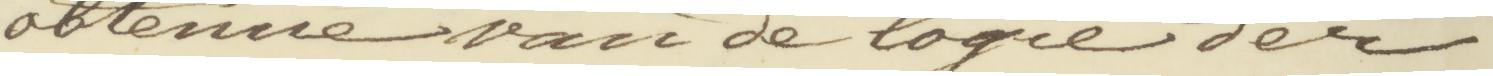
obtenue van de logie der
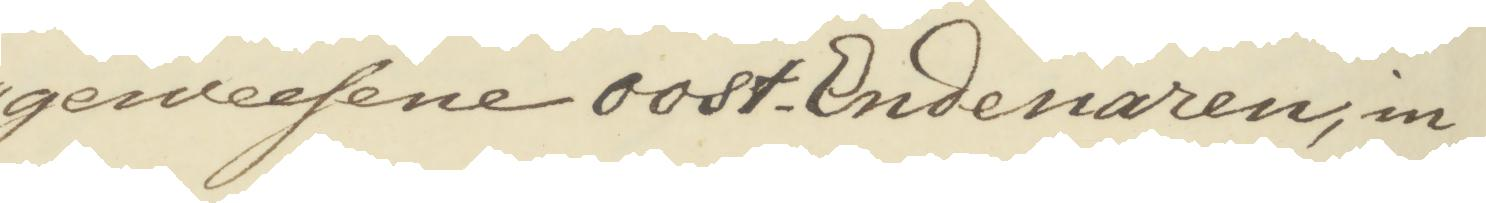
geweesene oost-Endenaren, in
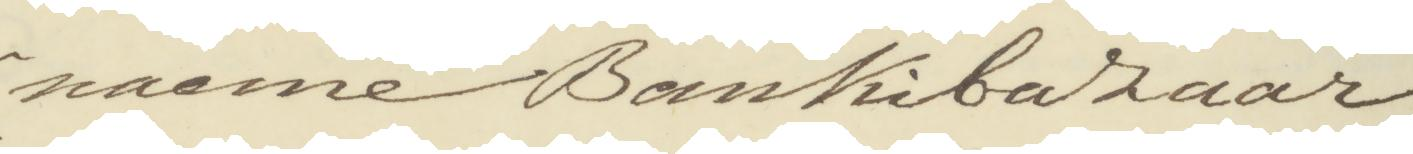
naeme Bankibazaar
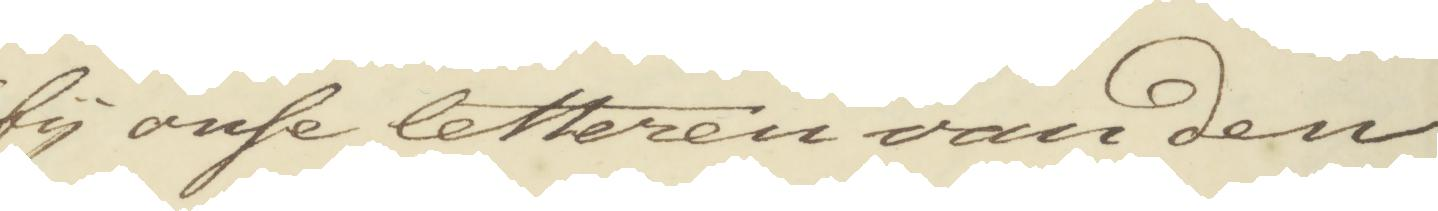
bij onse letteren van den
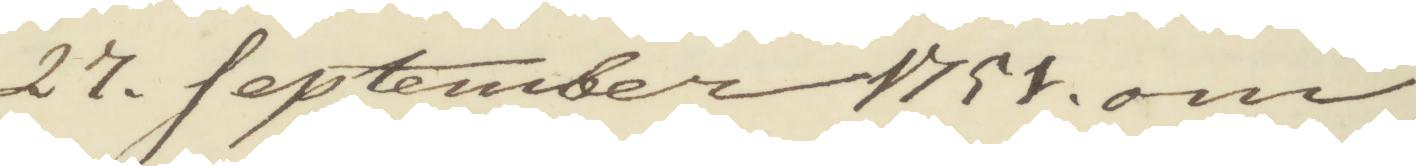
27. september 1751. om
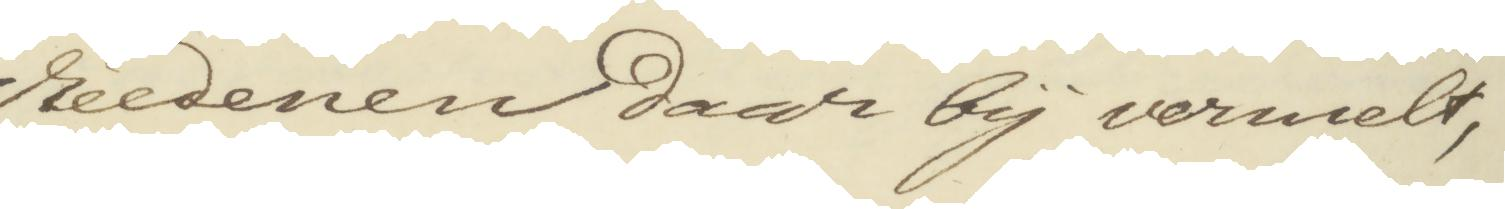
reedenen daar bij vermelt,
